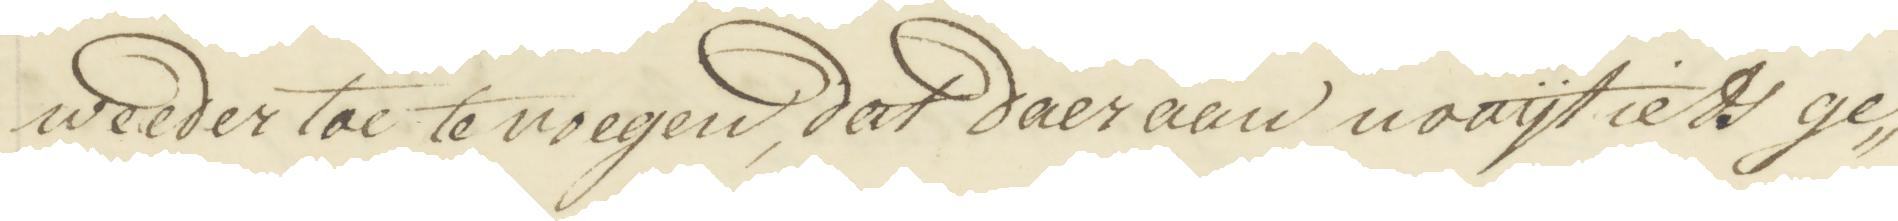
weeder toe te voegen, dat daer aan nooijt iets ge„
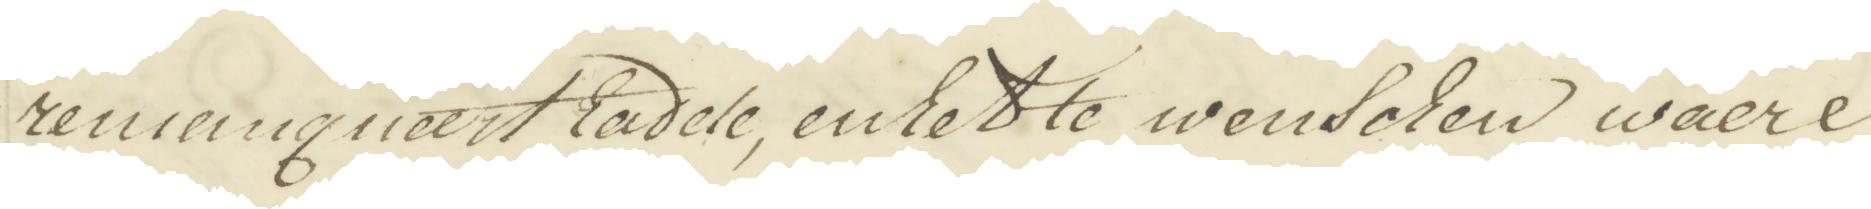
remanqueert hadele, en het te wenschen waere
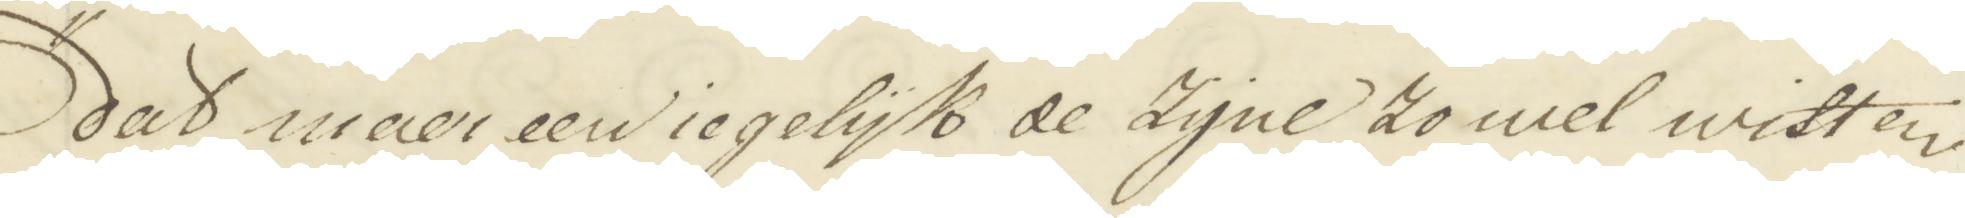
dat maar een iegelijk de zijne zo wel wisten
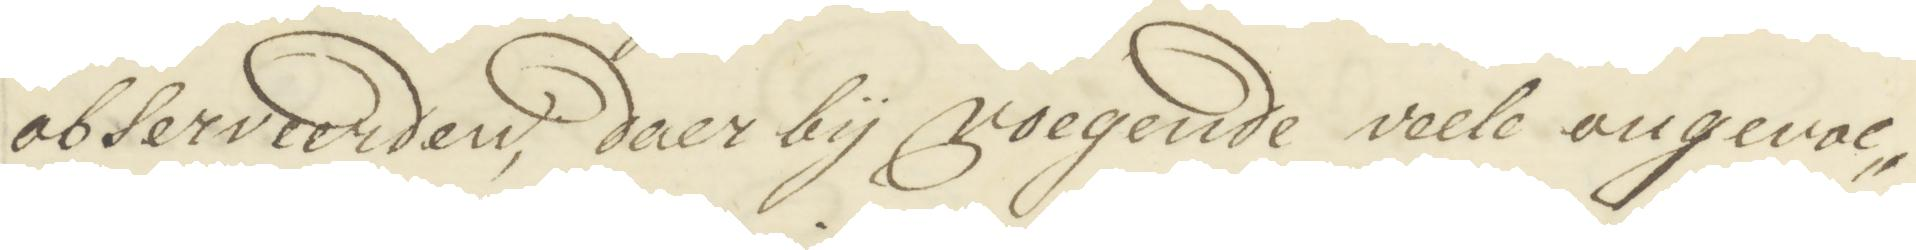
observeerden, daer bij voegende veele ongevoe„
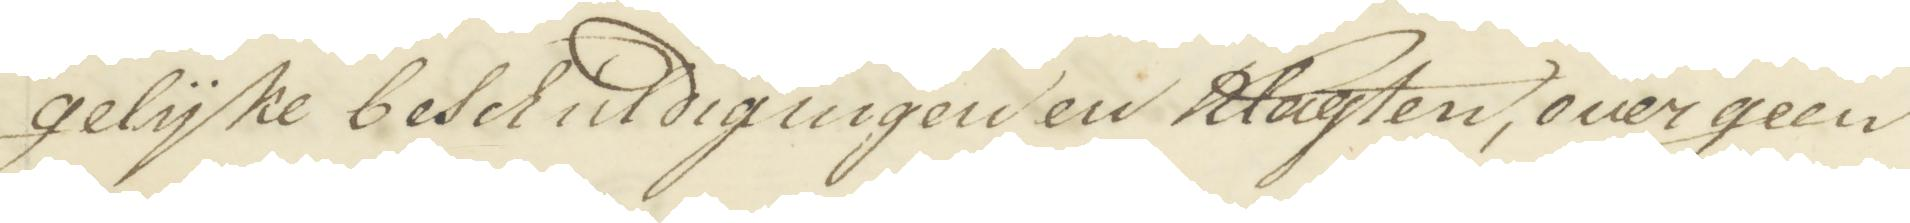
gelijke beschuldigingen en klagten, over geen
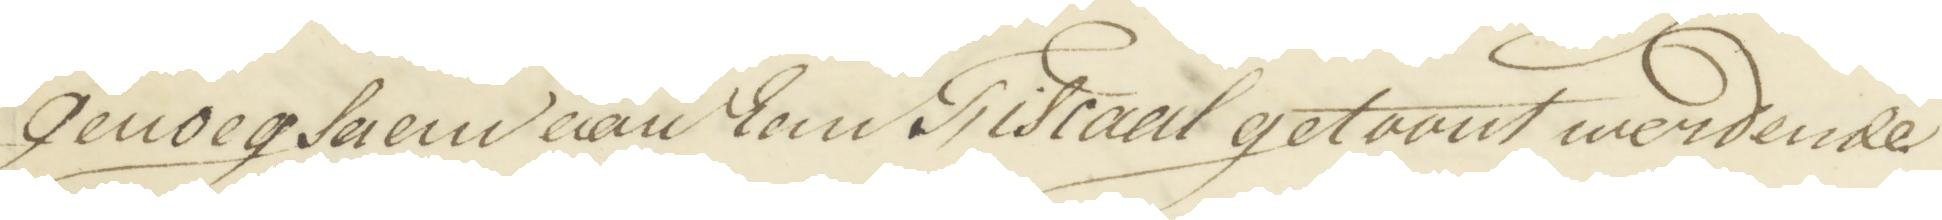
genoegsaem aan hem Fiscaal getoont werdende
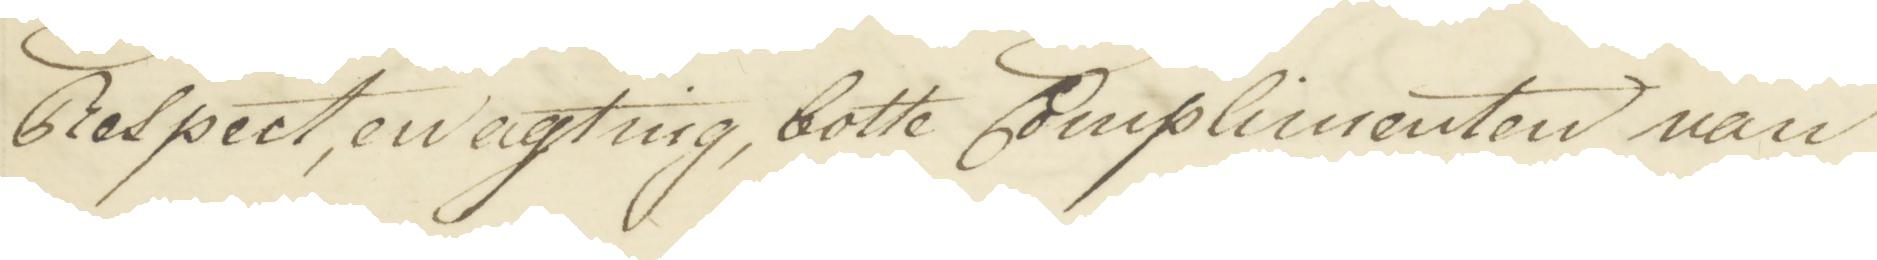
Respect, en agting, botte Complimenten van
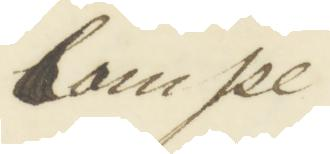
Compe
